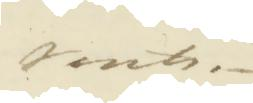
voorts.
